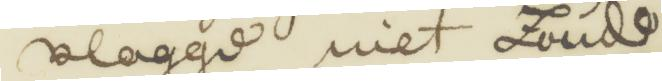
vlagge niet zoude
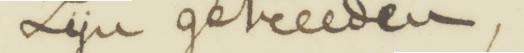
zijn getreeden,
